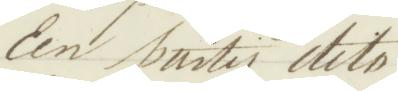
Een partij dito
